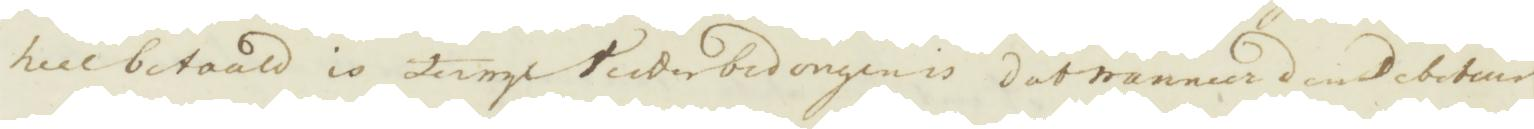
heel betaald is terwyl Verder bedongen is dat wanneer den Debiteur
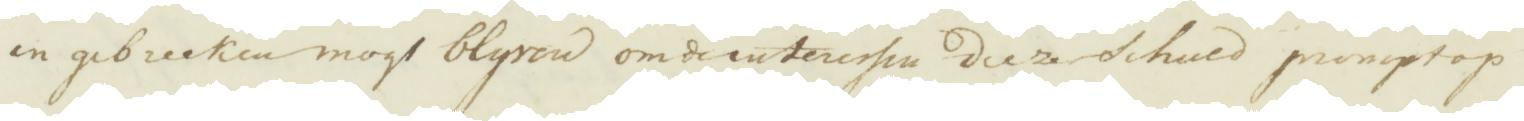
in gebreeken mogt blyven om de interessen deezer schuld prompt op
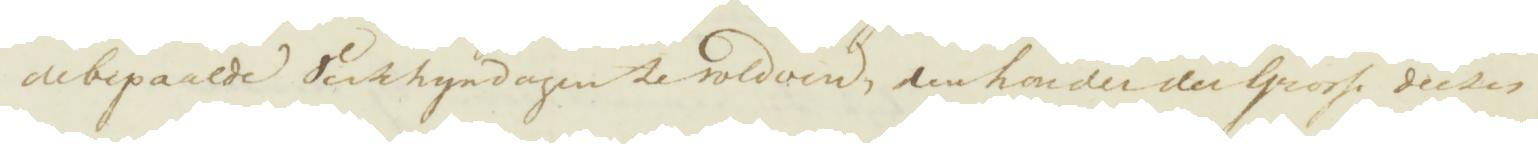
de bepaalde verschyndagen te voldoen, den houder der grosse deezes
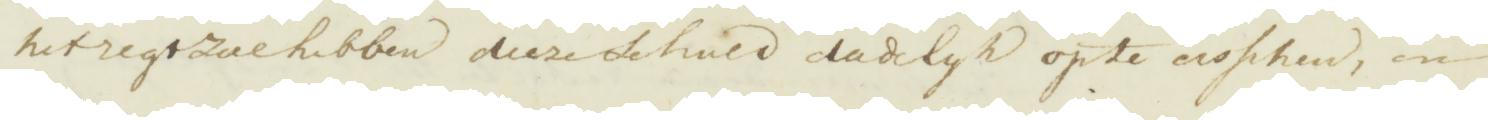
het regt zal hebben deeze schuld dadelyk op te eisschen, en
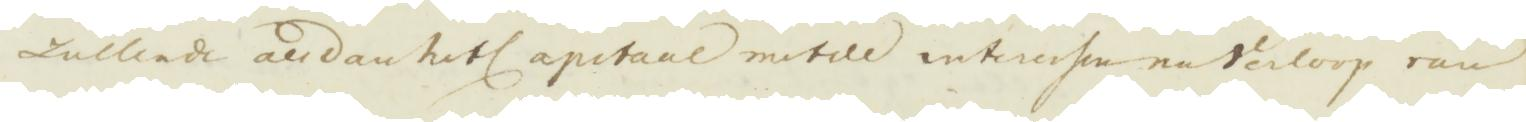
zullende als dan het Capitaal met de interessen na verloop van
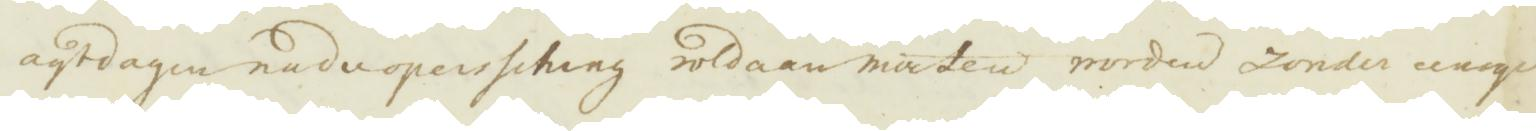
agt dagen na die opeissching voldaan moeten worden zonder eenige
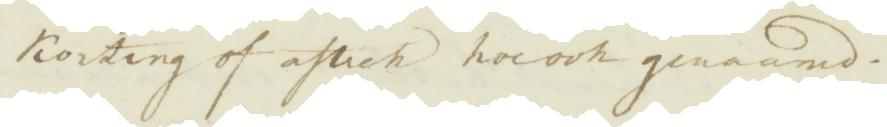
Korting of aftrek hoe ook genaamd.
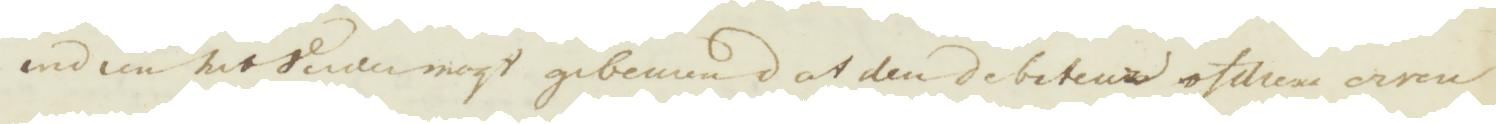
indien het Verder mogt gebeuren dat den debiteur of diens erven
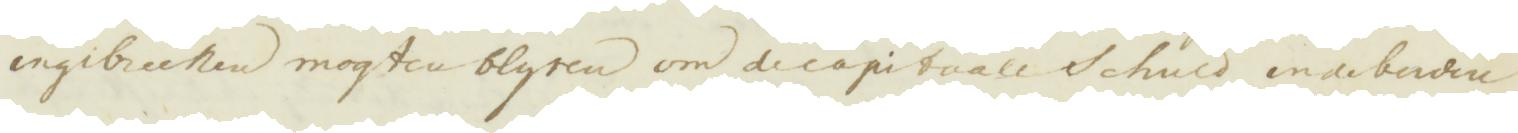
ingibreeken mogten blyven om de capitaale schuld in de beiden
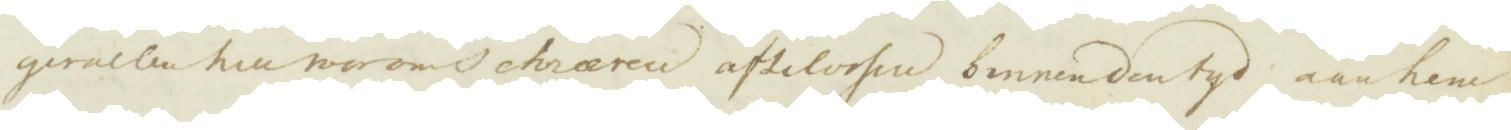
gevallen hier voor omschreeven afte lossen binnen den tyd aan hem
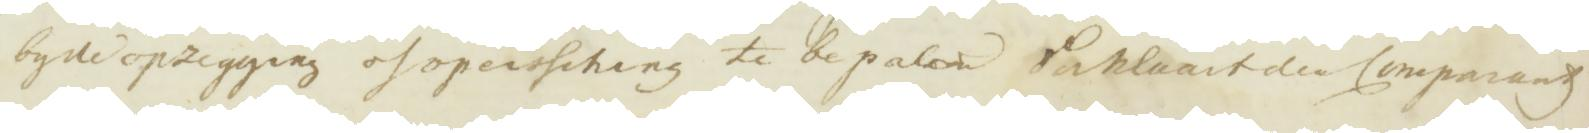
by de opzegging of opeissching te bepalen Verklaart den Comparant
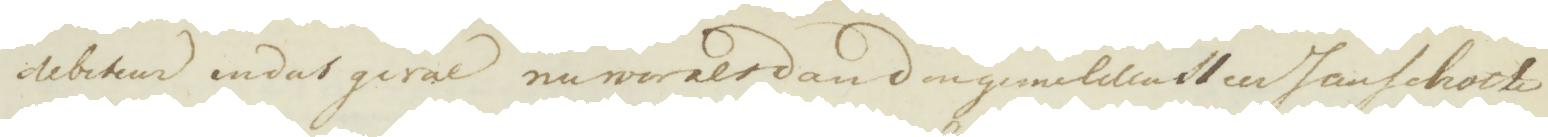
debiteur in dat geval nu voor als dan den gemelden Heer Jan Scholte
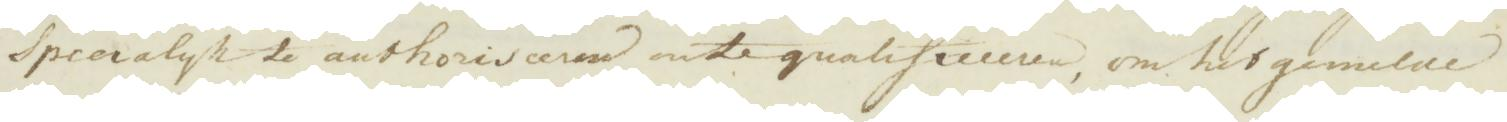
Specialyk te authoriseeren en te qualifceeren, om het gemelde
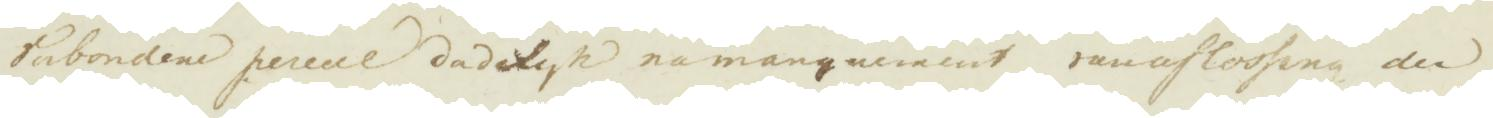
Verbondene perceel dadelyk na manquement van aflossing der
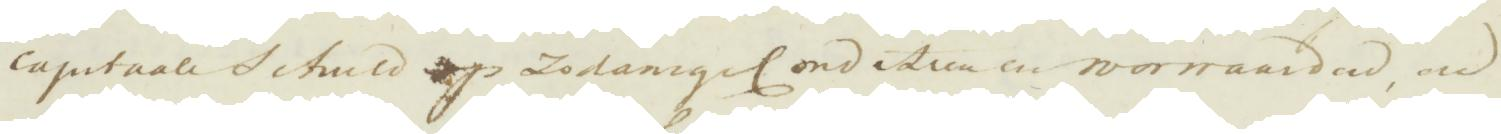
capitaale Schuld op Zodanige Conditien en voorwaarden, de
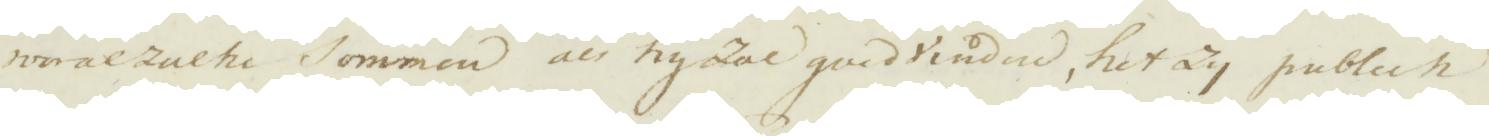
voor al zulke Sommen als hy zal goedvinden, het zy publiek
